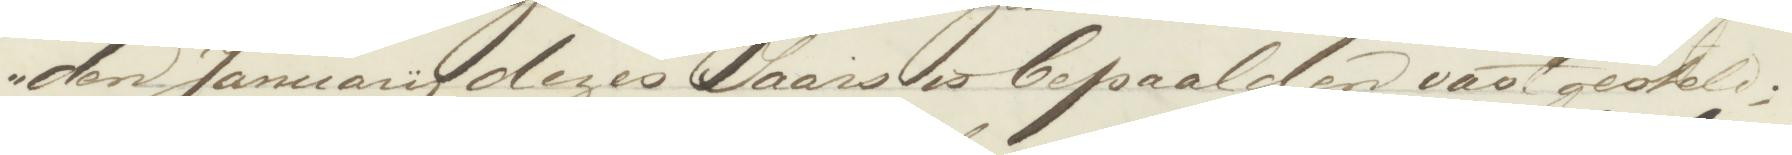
„den Januarij dezes Jaars is bepaalden vast gesteld;
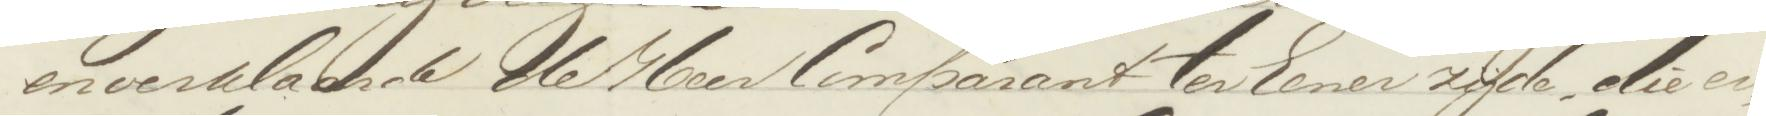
en verklaarde de Heer Comparant ter Eener zijde, die er
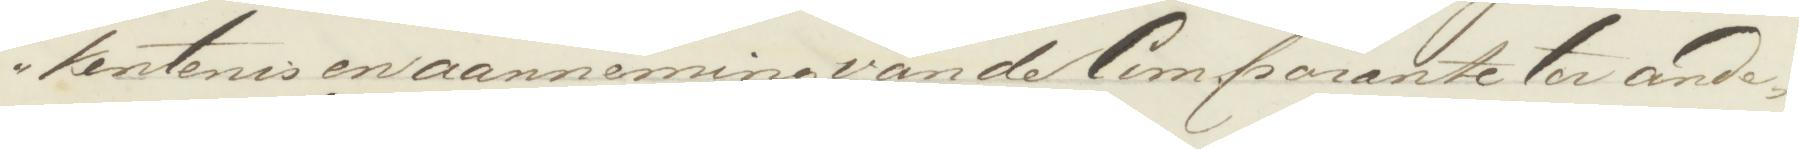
„kentenis en aanneming van de Comparante ter ande„
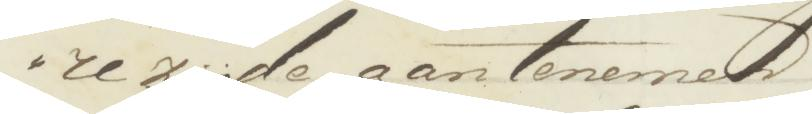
„re zijde aantenemen
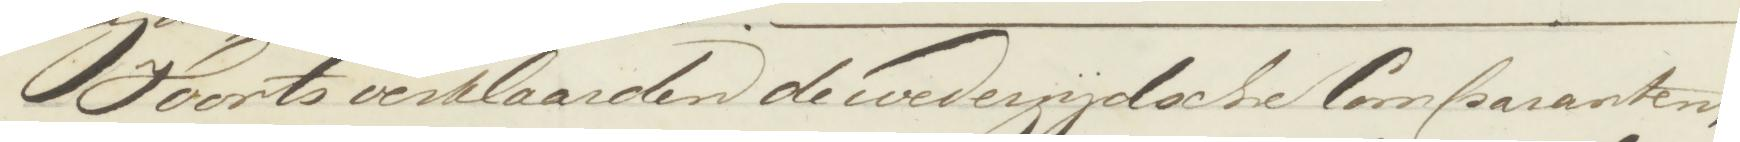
Voorts verklaarden de wederzijdsche Comparanten,
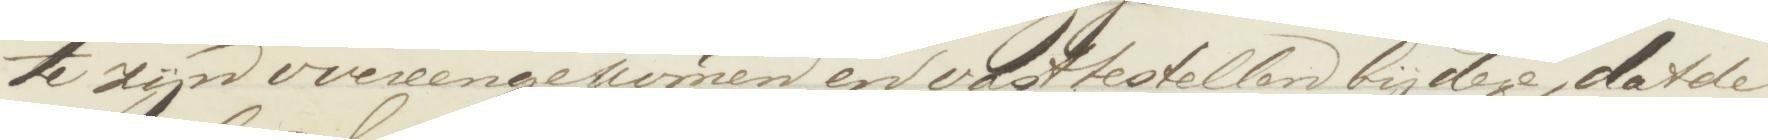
te zijn overeengekomen en vasttestellen bij deze, dat de
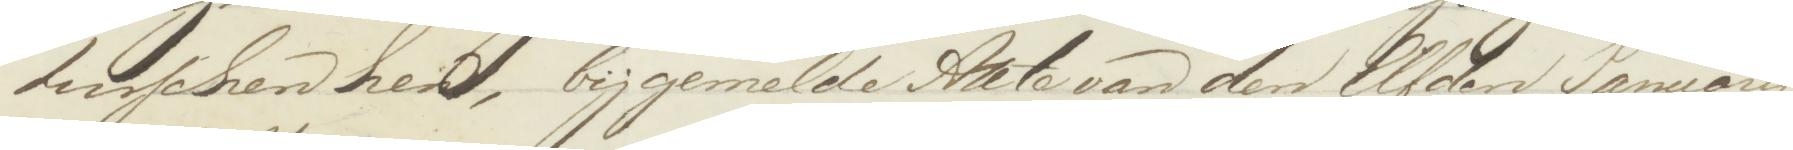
tusschen hen, bij gemelde Akte van den Elfden Januarij
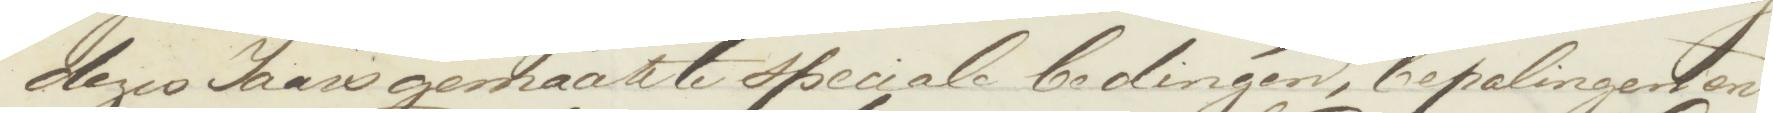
dezes Jaars gemaakte speciale bedingen, bepalingen en
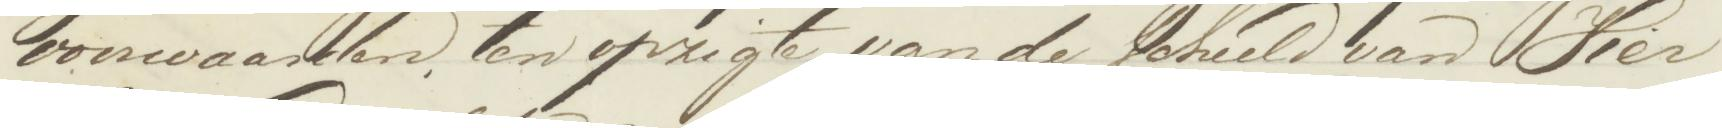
voorwaarden, ten opzigte van de schuld van Vier
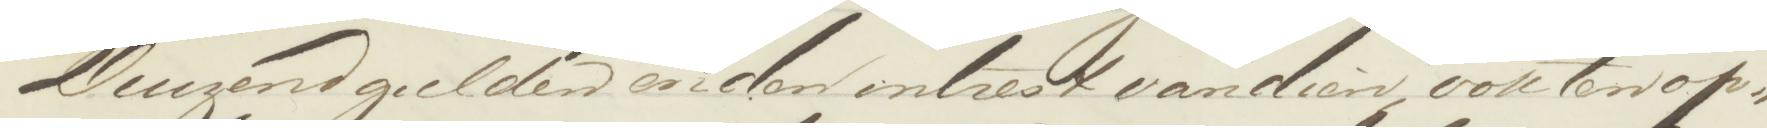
Duizend gulden en den intrest van dien ook ten op„
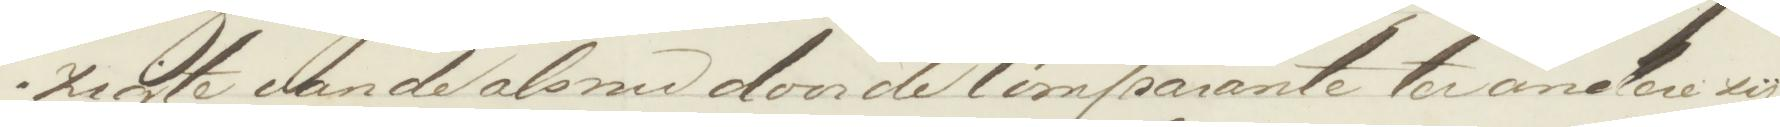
,zigte van de als nu door de Comparante ter andere zij
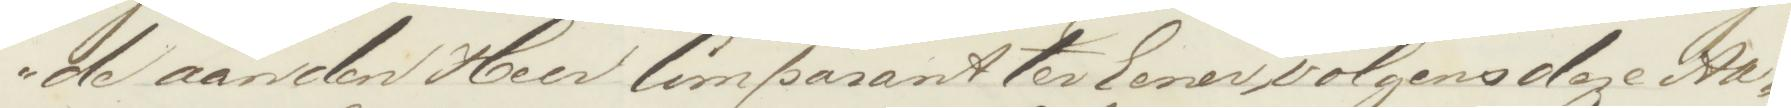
„de aan den Heer Comparant ter Eener volgens deze Ak„
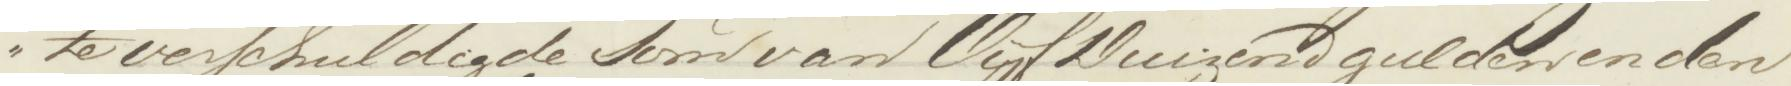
„ te verschuldigde som van Vijf Duizend gulden en den
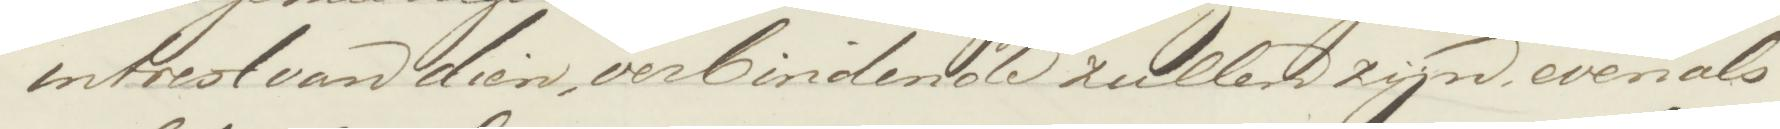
intrest van dien, verbindende zullen zijn, evenals
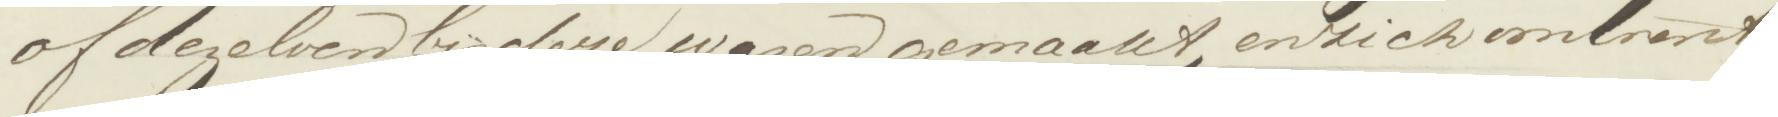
of dezelven bij deze waren gemaakt, en zich omtrent
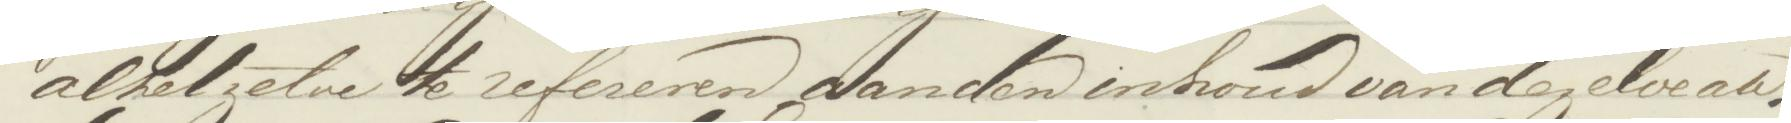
alhetzelve te refereren, aan den inhoud van dezelve ak,
